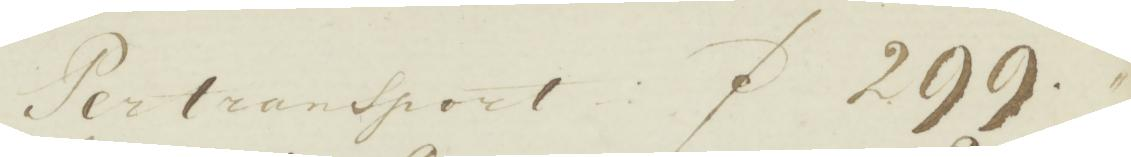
Per transport ƒ 299. „
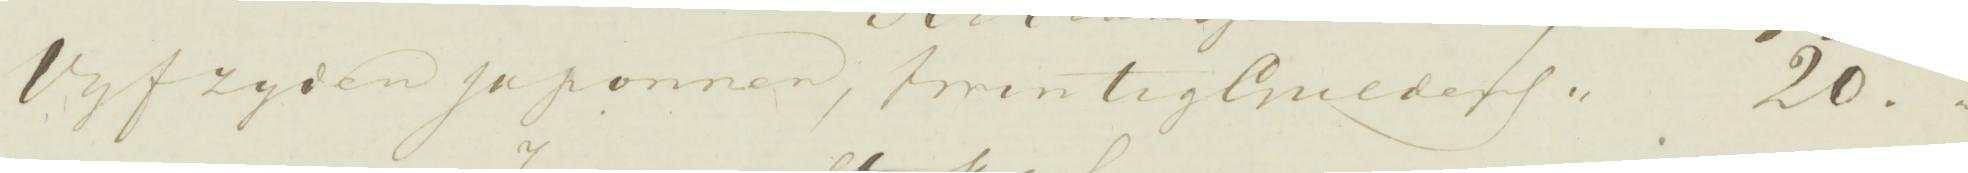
Vyf zyden japonnen, twintig Guldens „ 20„
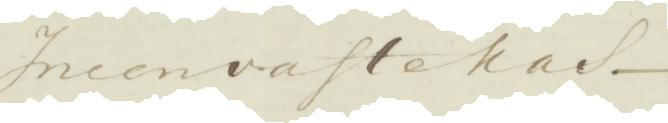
Ineenvastekas—
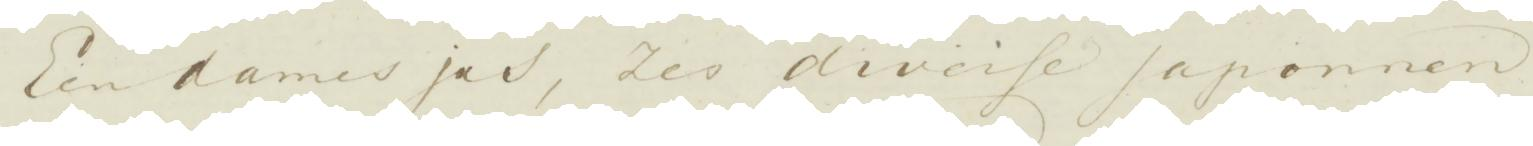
Een dames jas, zes diverse Japonnen
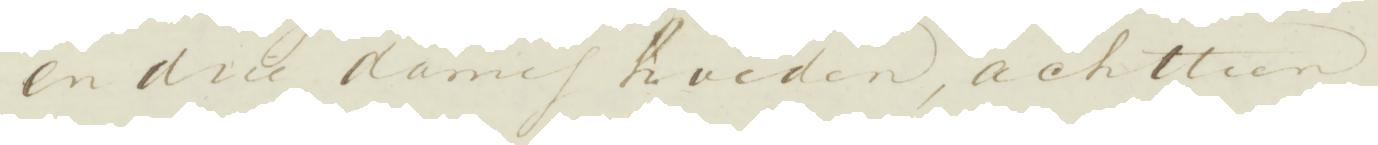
en drie dames hoeden, achttien
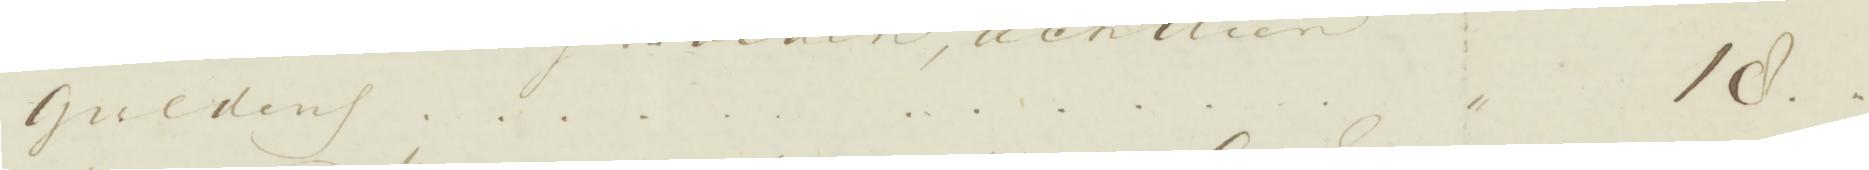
Guldens . . . . . . . . . . . . „18. .
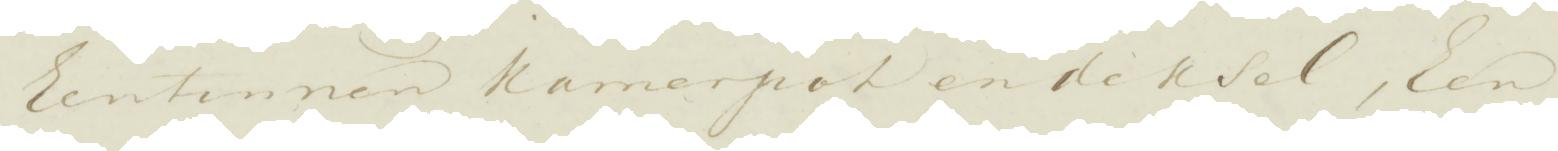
Eentinnen Kamerpot en deksel, Een
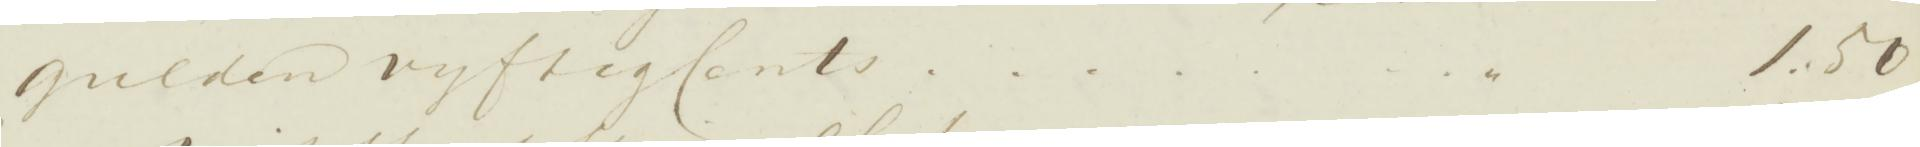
gulden vijftig Cents . . . . . . . . „ 1.:50
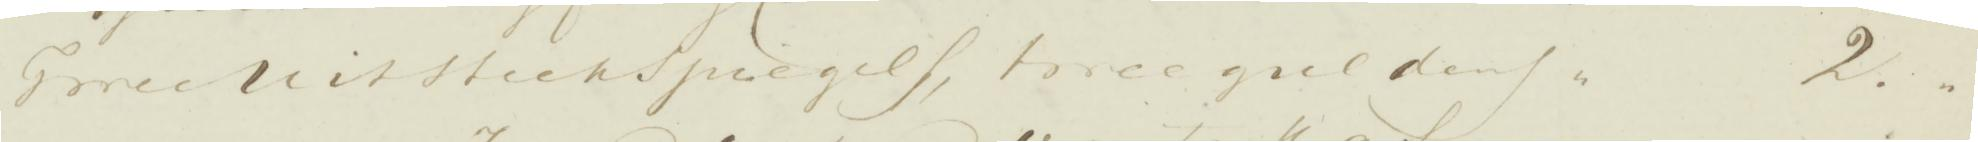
Twee uitsteekspiegels, twee guldens „ 2. „
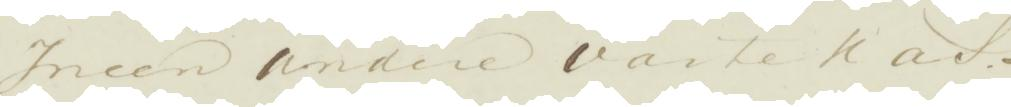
In een andere vaste kas.
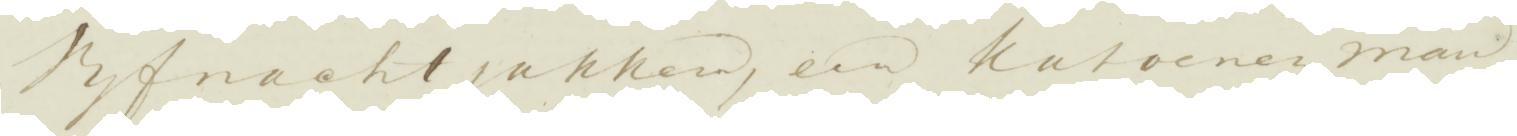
Vyfnachtjakken, een katoenen man
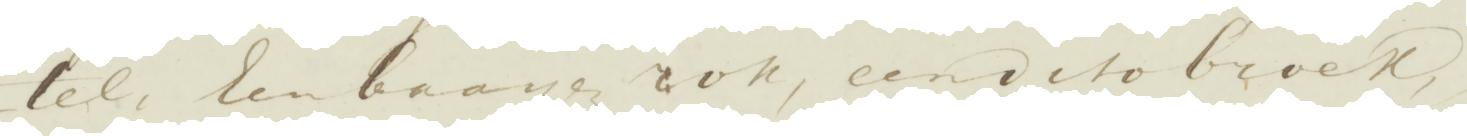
tel, Een baayen rok, een dito broek,
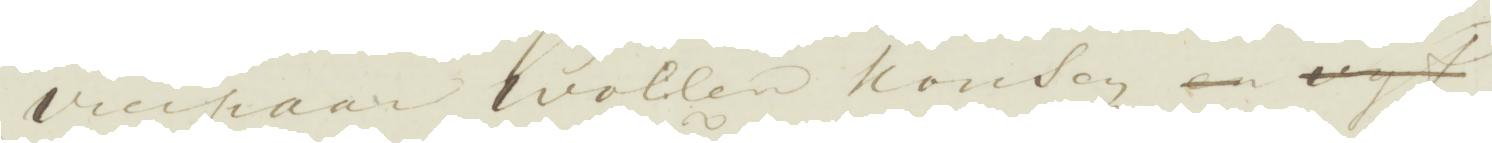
vierpaar wollen kousen en vyf
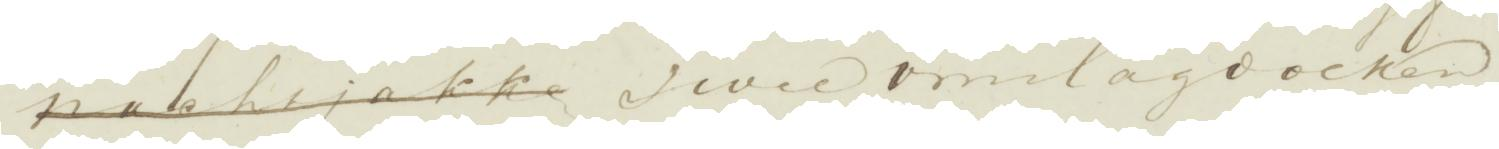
nachtjakken Twee omslagdoeken
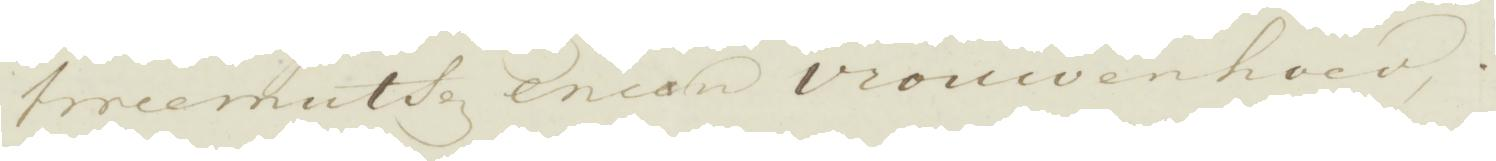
tweemutsen eneen Vrouwenhoed, .
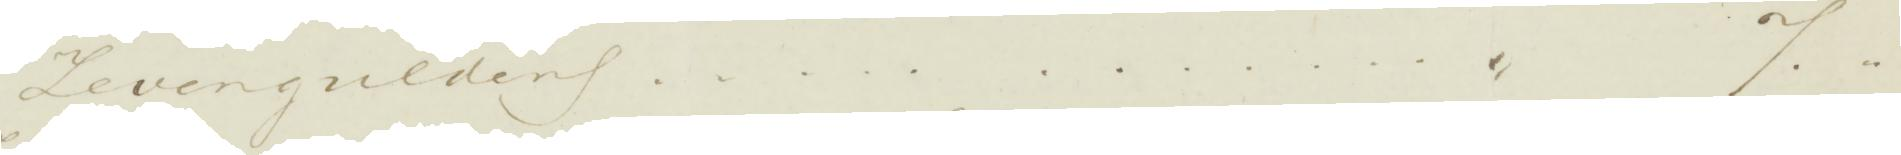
Zeven guldens . . . . . . . . . . . . „ 7. „
